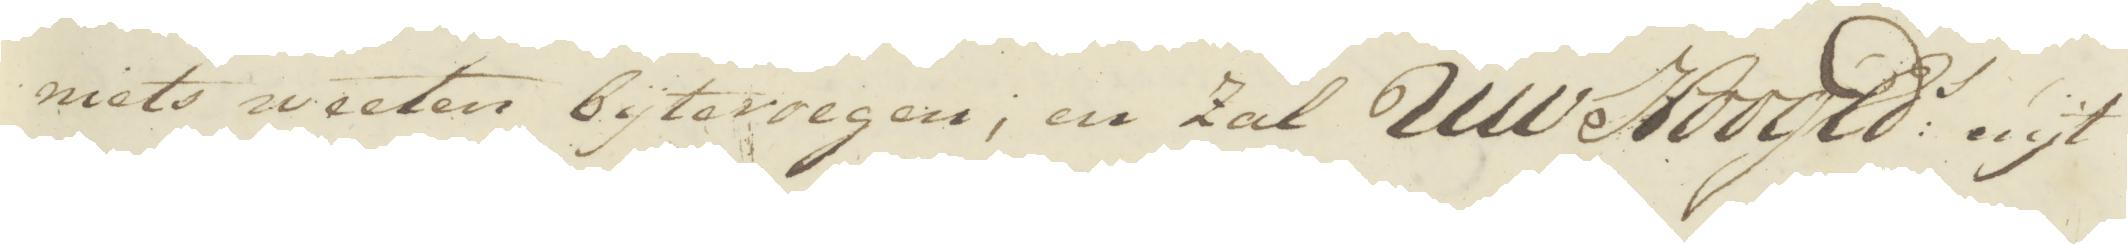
niets weeten bijtevoegen; en zal uw HoogEd:s uijt
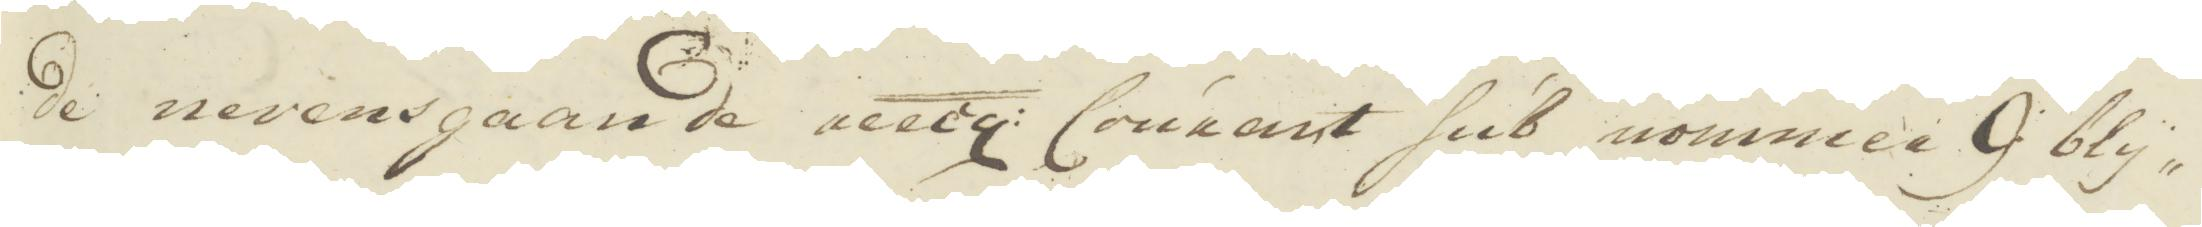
de nevensgaande reecq: Courant sub nommer 9. blij„
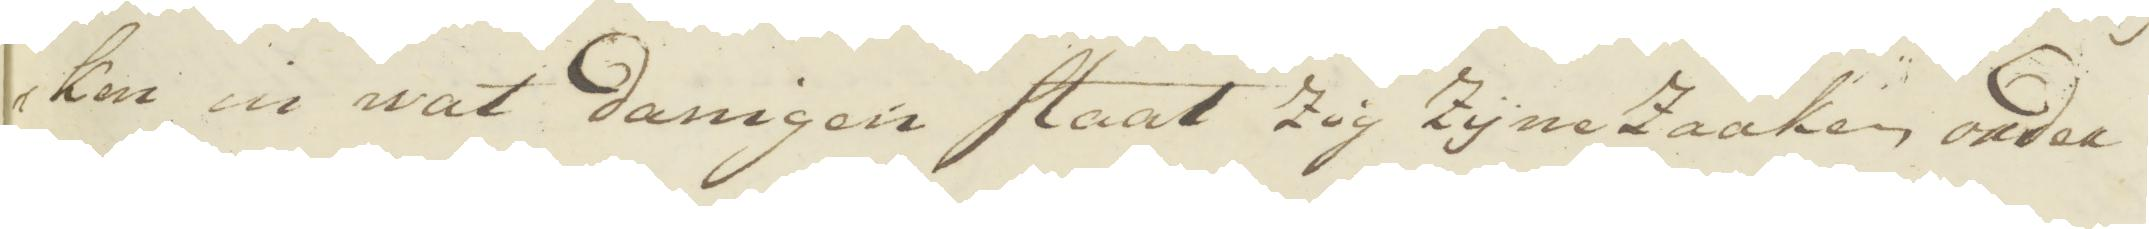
„ken in wat danigen staat zig zijne zaaken order
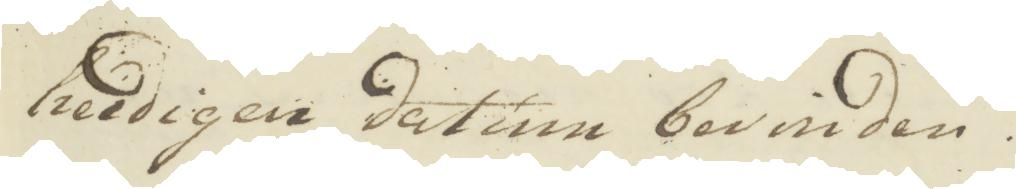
heedigen datum bevinden.
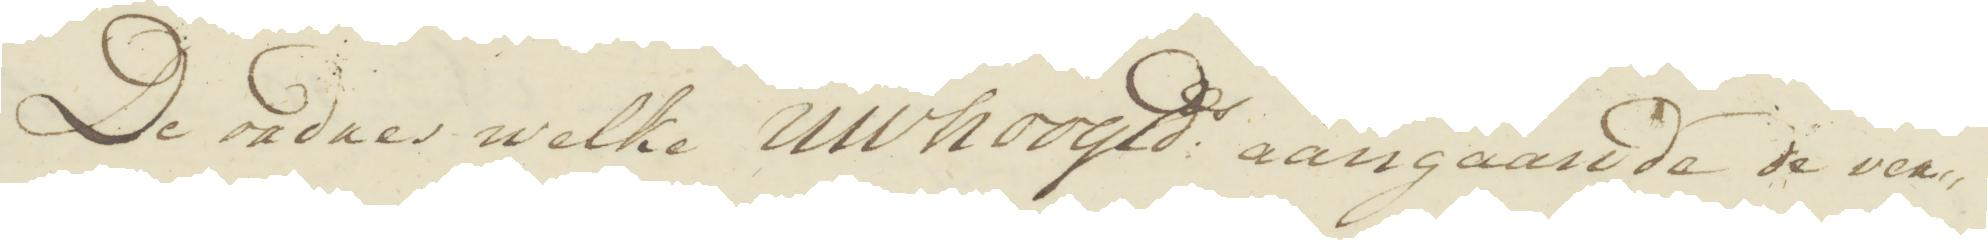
De ordres welke uw hoogEd:s aangaande de ver„
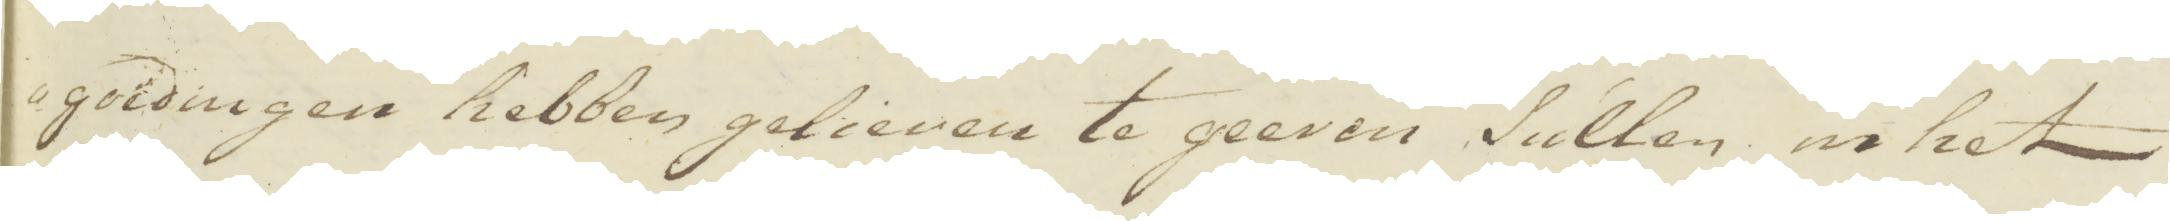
„goedingen hebben gelieven te geeven sullen in het
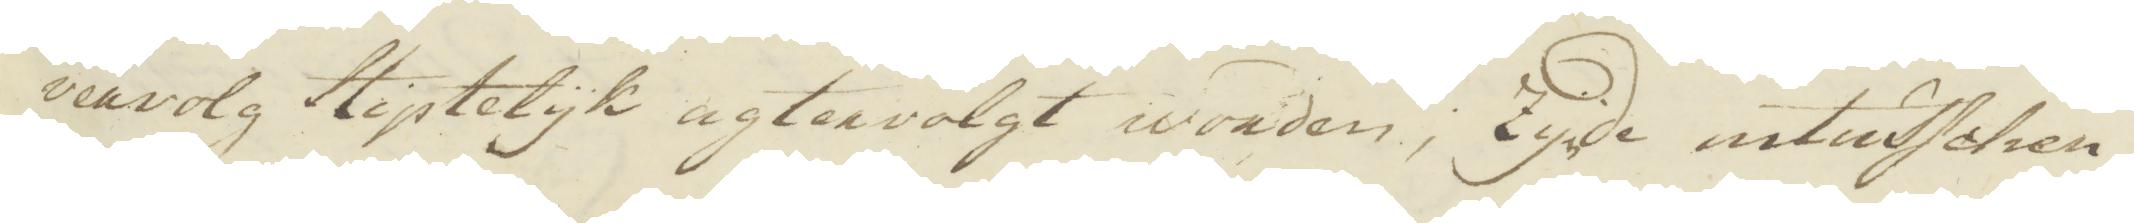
vervolg stiptelijk agtervolgt worden; zijnde intusschen
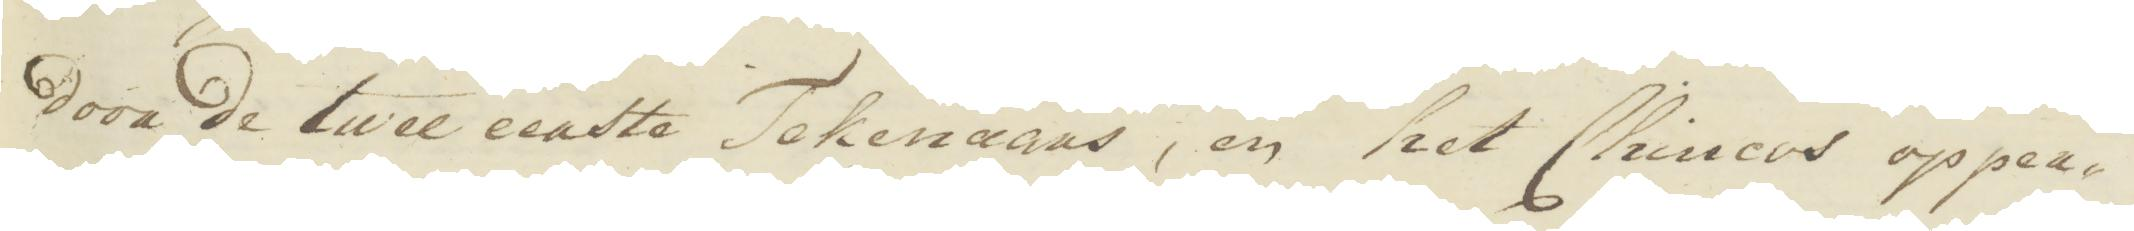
door de twee eerste Tekenaars, en het Chincos opper„
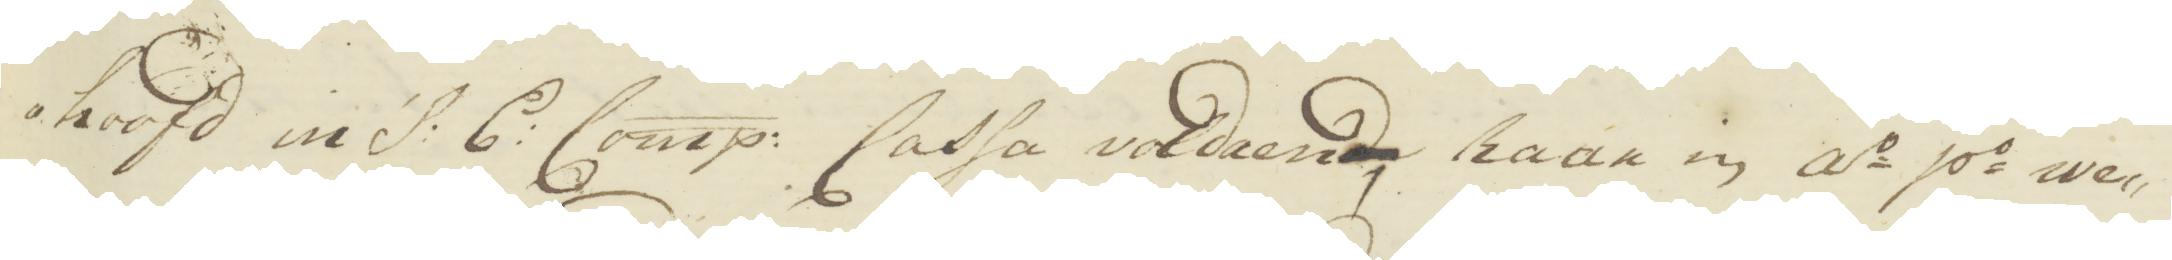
hoofd in 's: E: Comp: Cassa voldaend, haar in a=o p=o we„
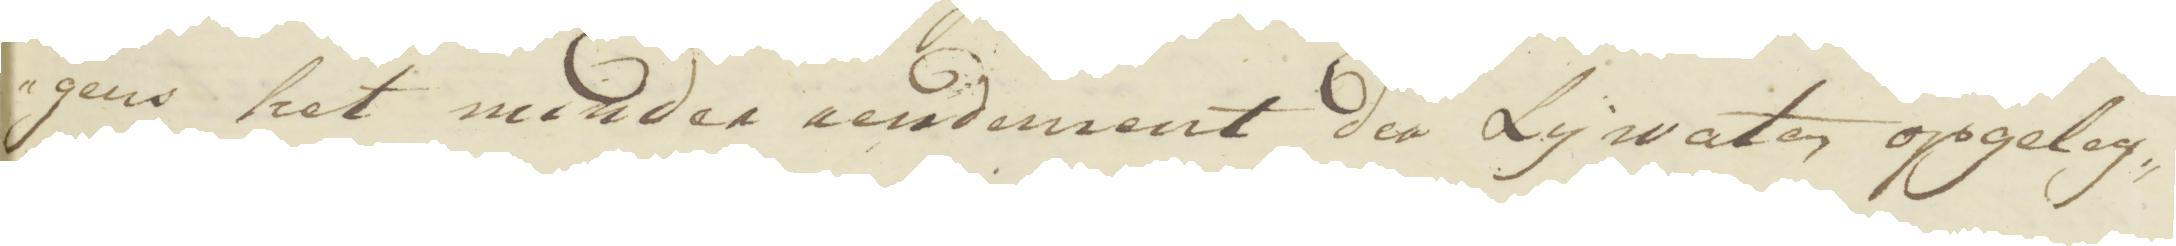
„gens het minder rendement der Lijwaten opgeleg„
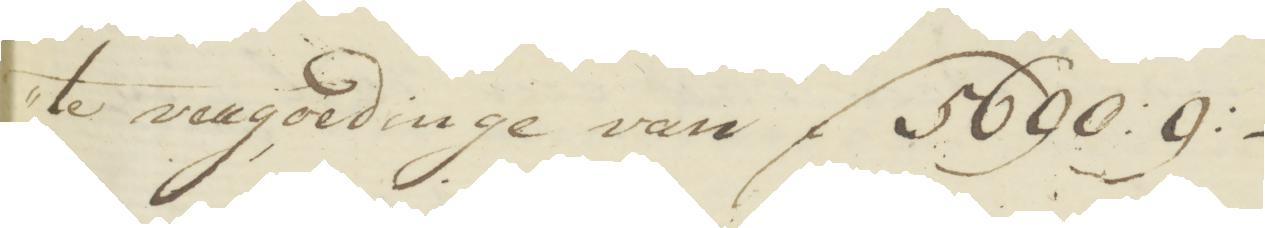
„te vergoedinge van ƒ5690:9:—
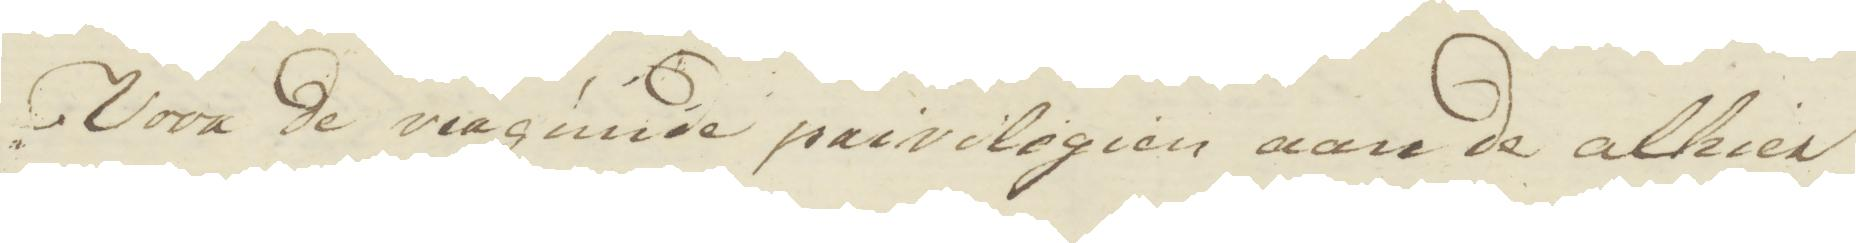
Voor de vergunde privilegien aan de alhier
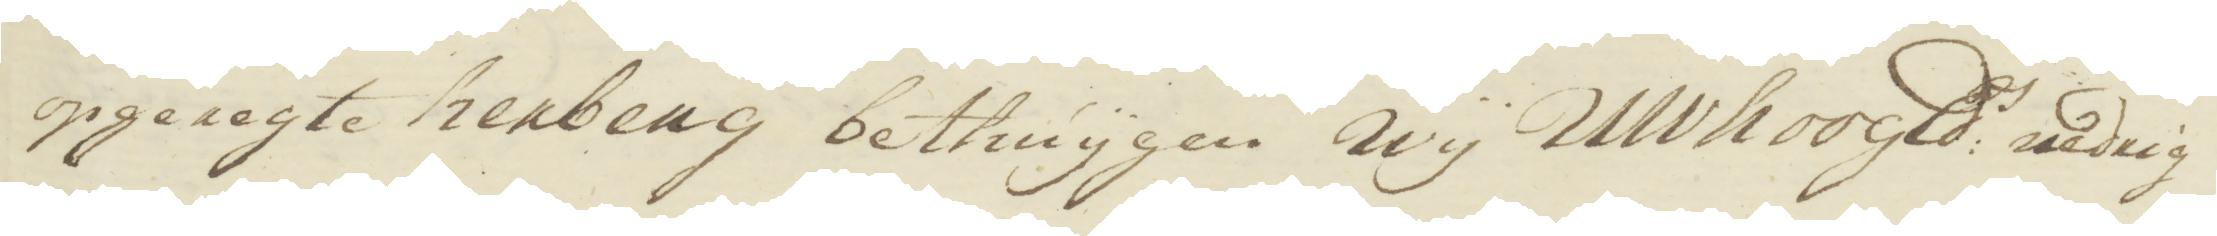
opgeregte herberg bethuijgen wij uw hoog Ed:s nedrig
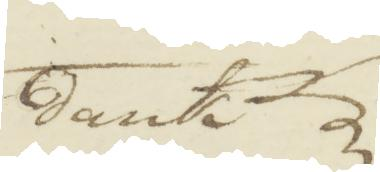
dank
